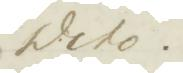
Dito . . . . . . . .
